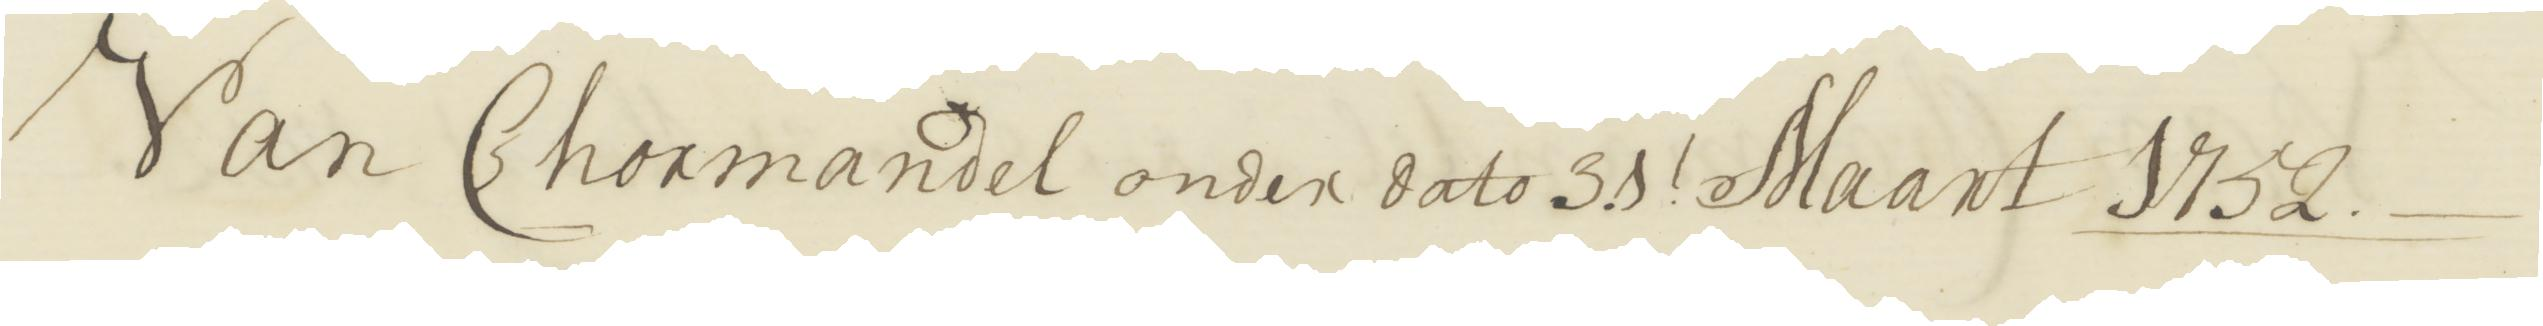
Van Chormandel onder dato 31:' Maart 1752. —
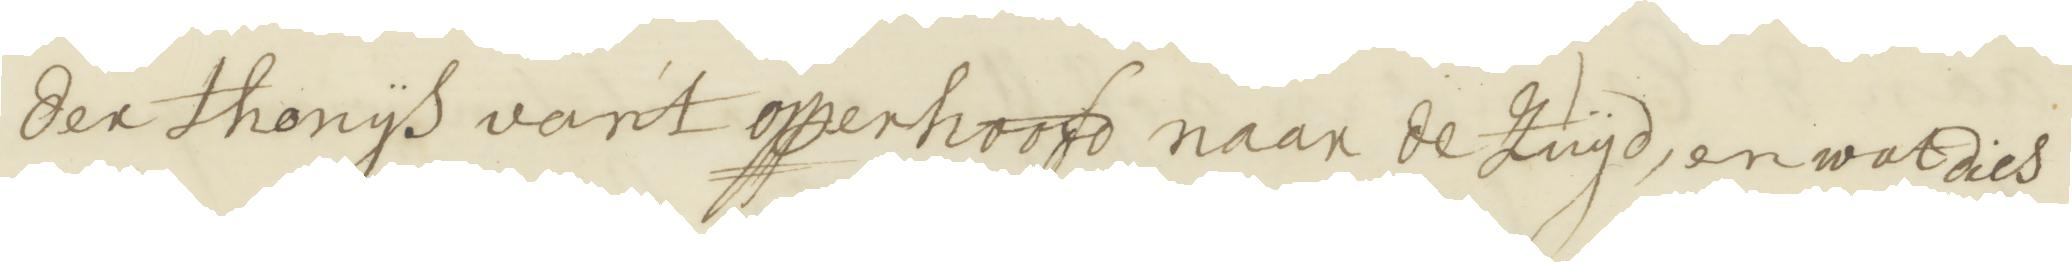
der thonijs van’t opperhoofd naar de zuijd, en wat dies
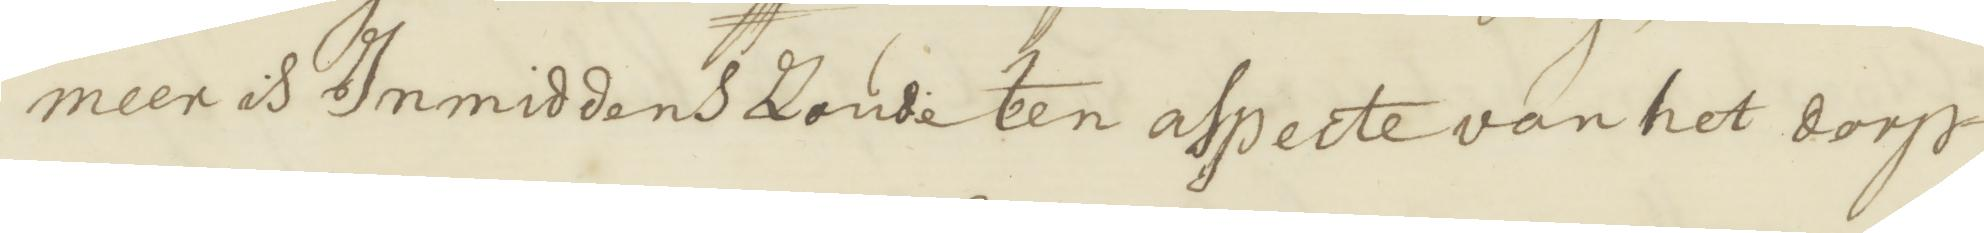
meer is Inmiddens zoude ten aspecte van het dorp
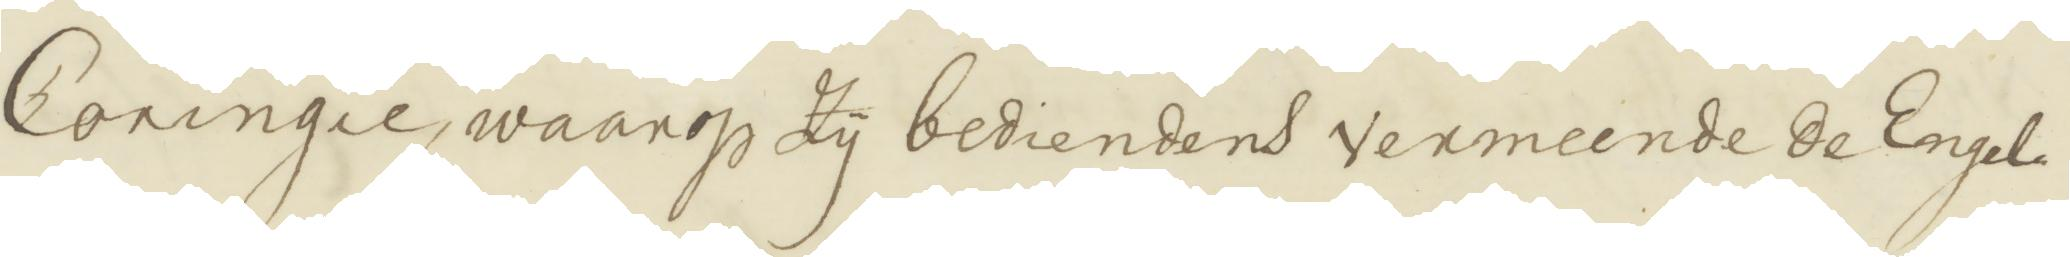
Coringie, waar op zij bediendens vermeende de Engel„
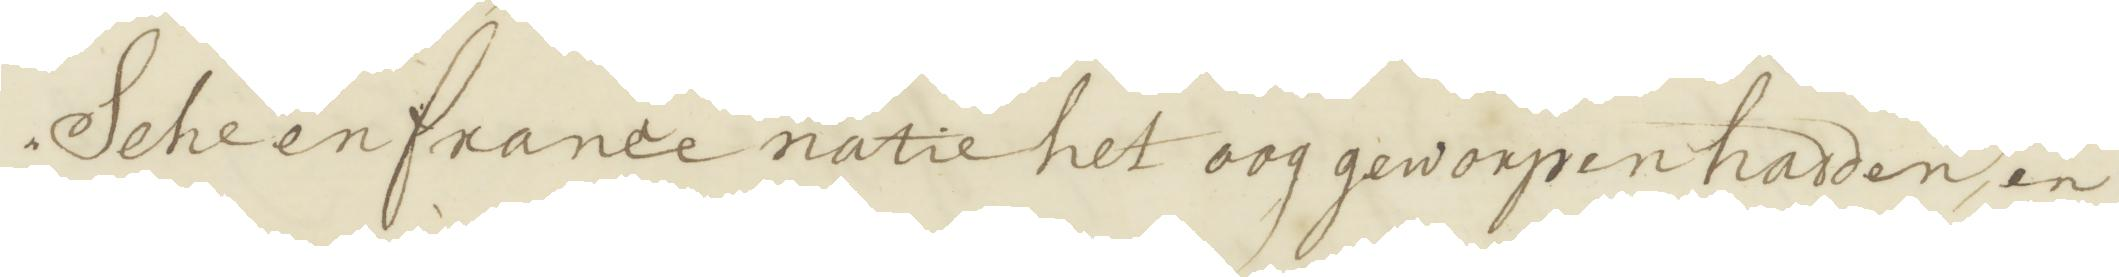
„sche en france natie het oog geworpen hadden, en
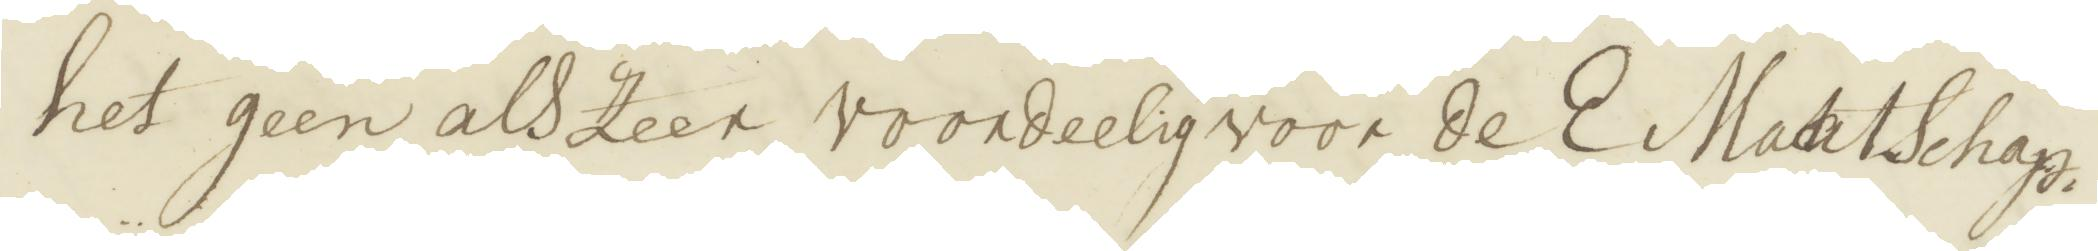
het geen als zeer voordeelig voor de E Maatschap„
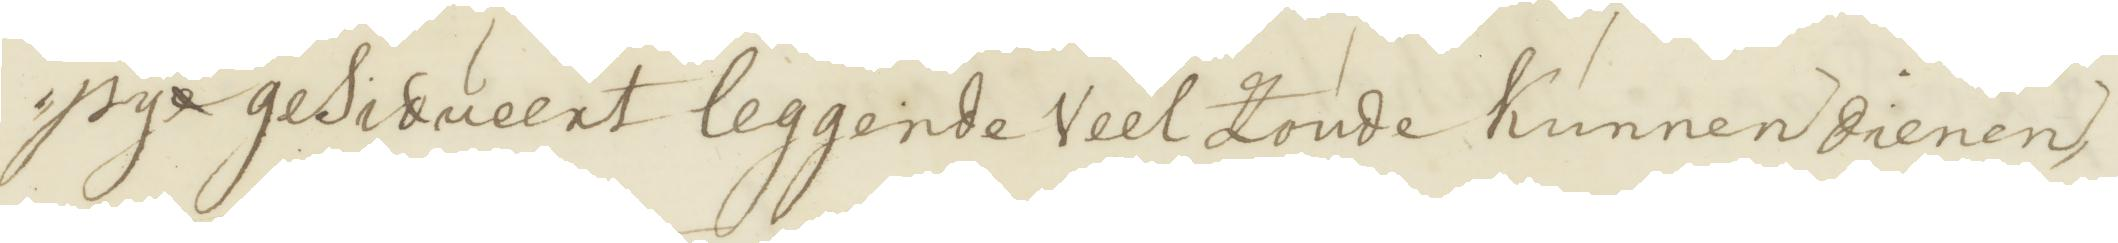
„pij gesidueert leggende veel zoude kunnen dienen,
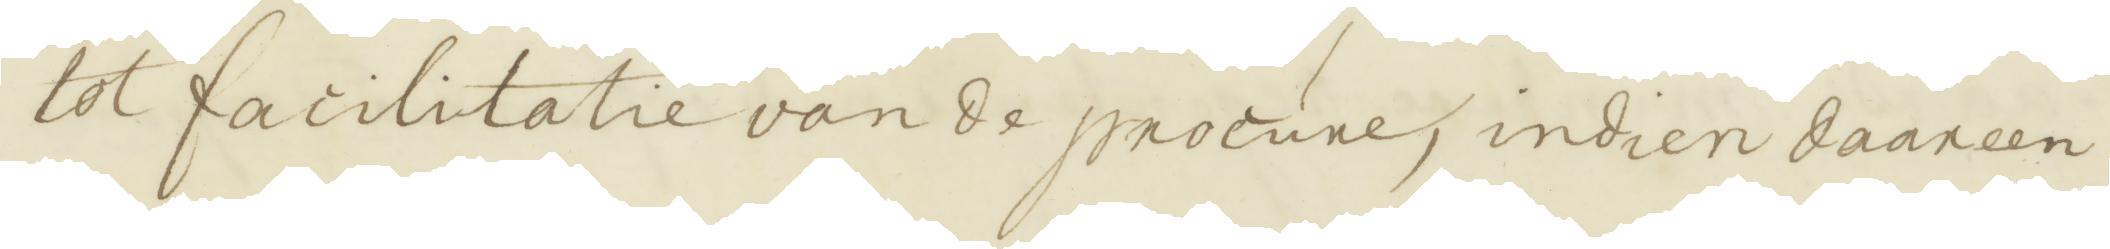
tot facilitatie van de procure, indien daar een
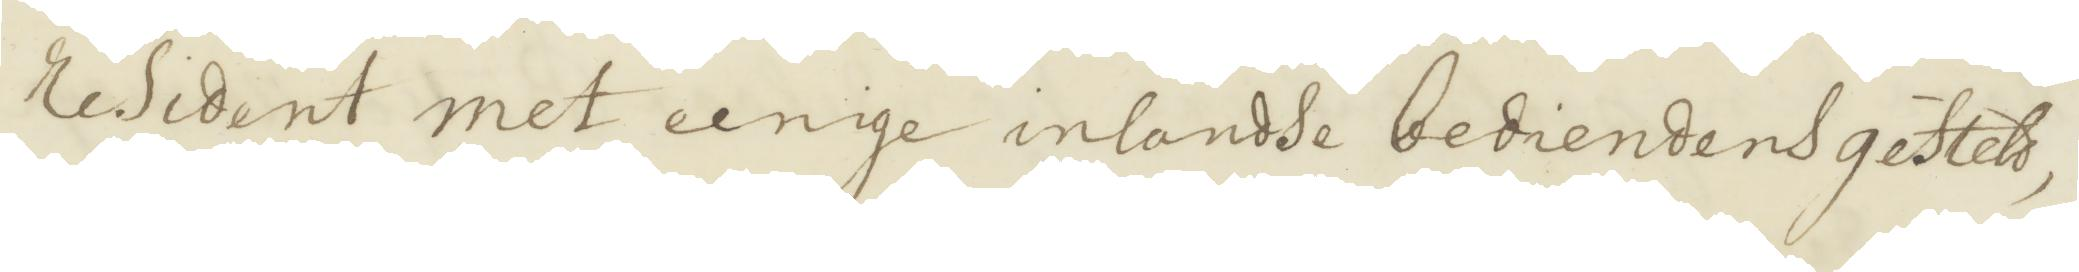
resident met eenige inlandse bediendens gesteld,
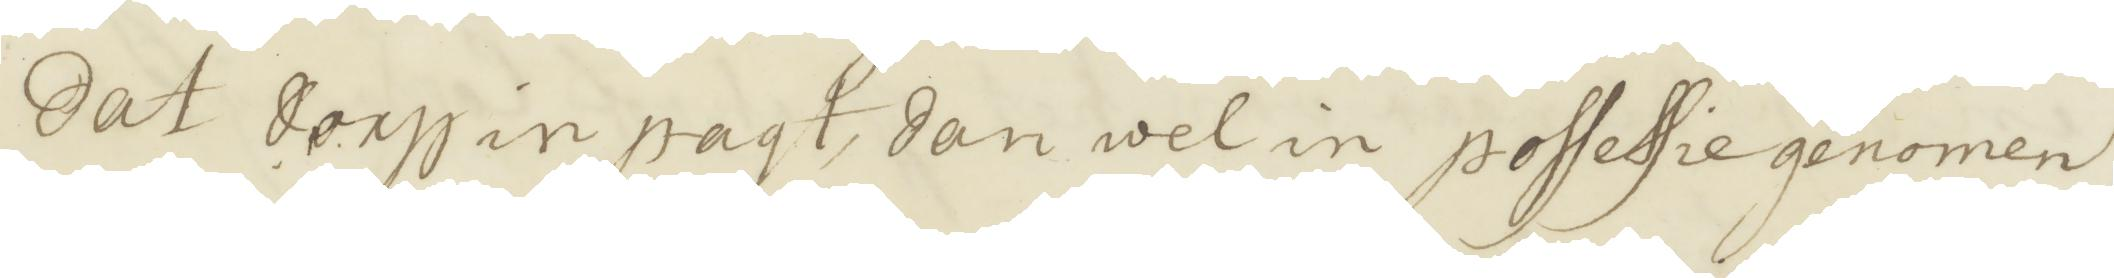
dat dorp in pagt, dan wel in possessie genomen
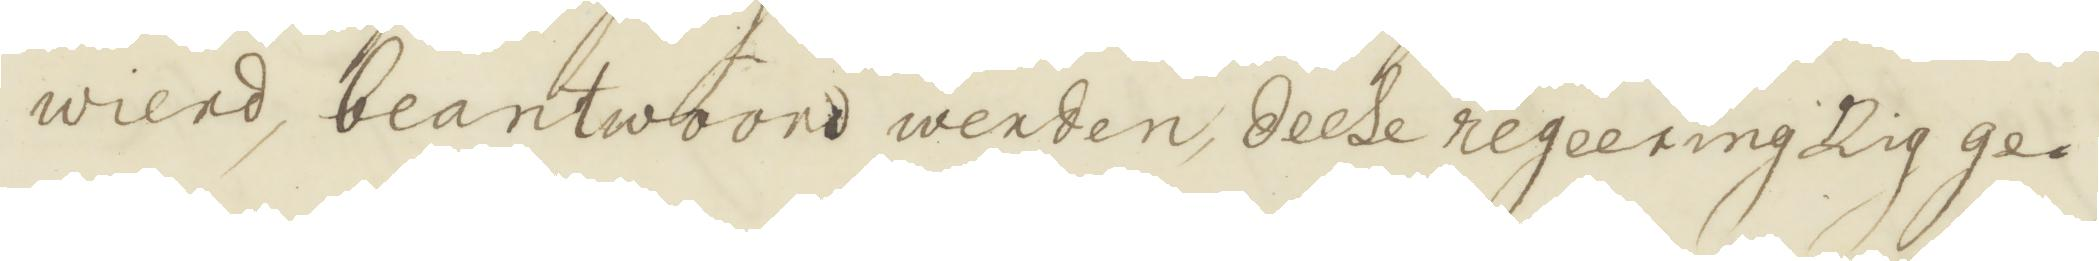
wierd, beantwoord werden, deese regeering zig ge„
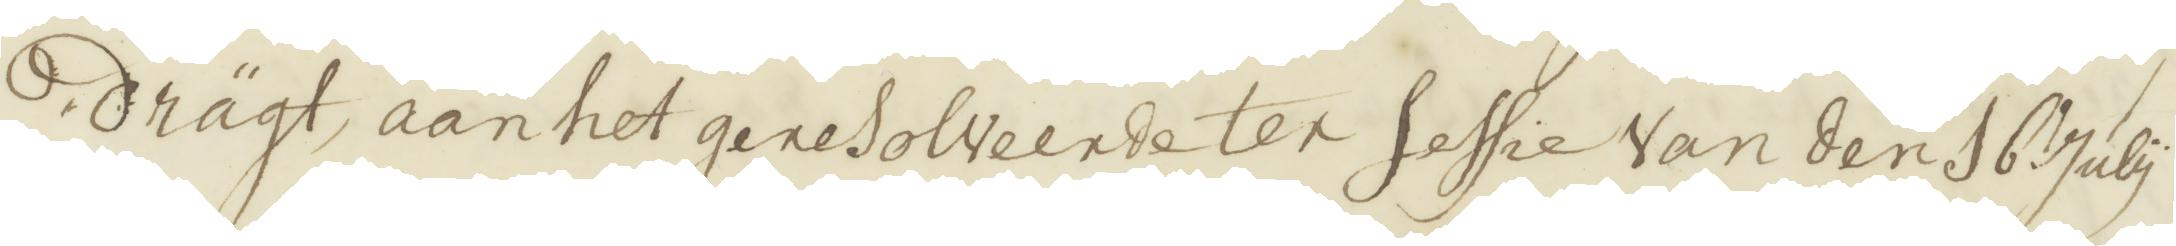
drägt, aan het geresolveerde ter sessie van den 16:' Julij
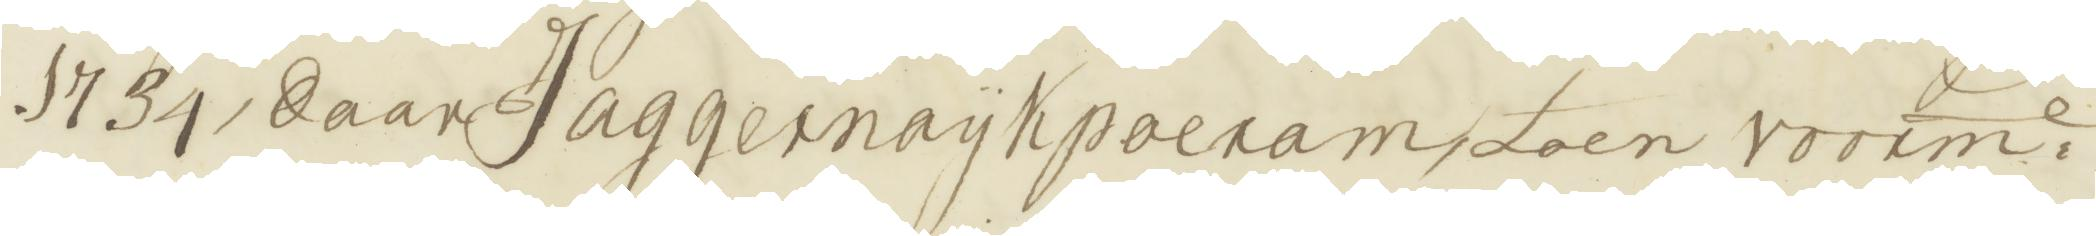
1734, daar Jaggernaijkpoeram, toen voorm„e
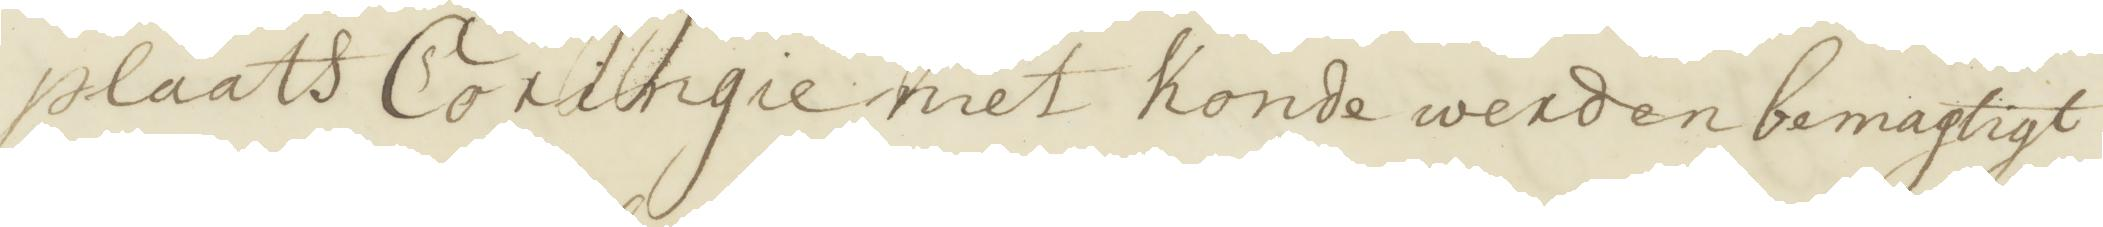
plaats Coringie niet konde werden bemagtigt
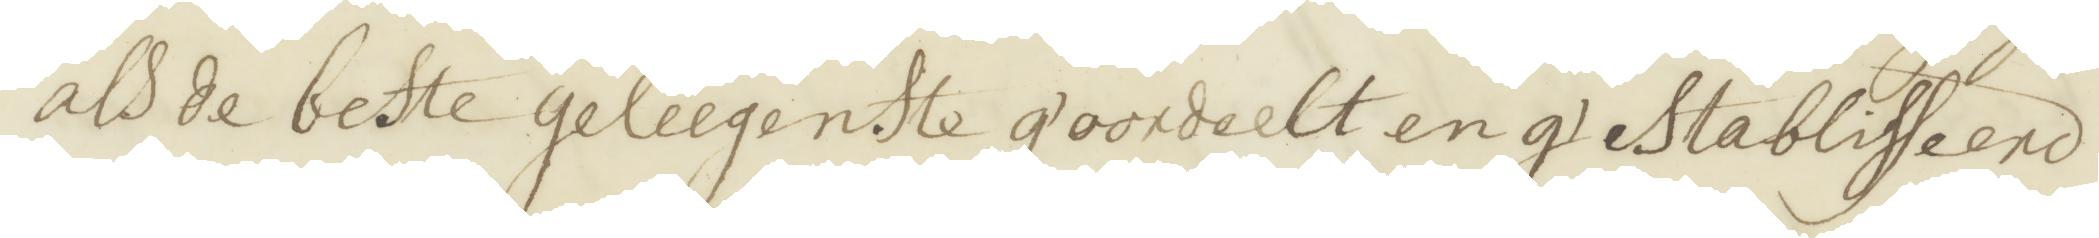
als de beste geleegenste g'oordeelt en g'establisseerd
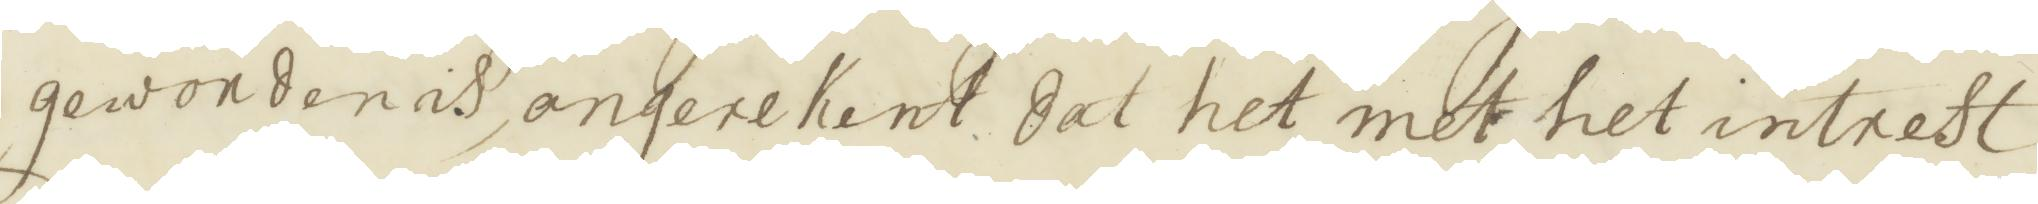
geworden is, ongerekent dat het met het intrest
